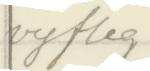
vyfteg
